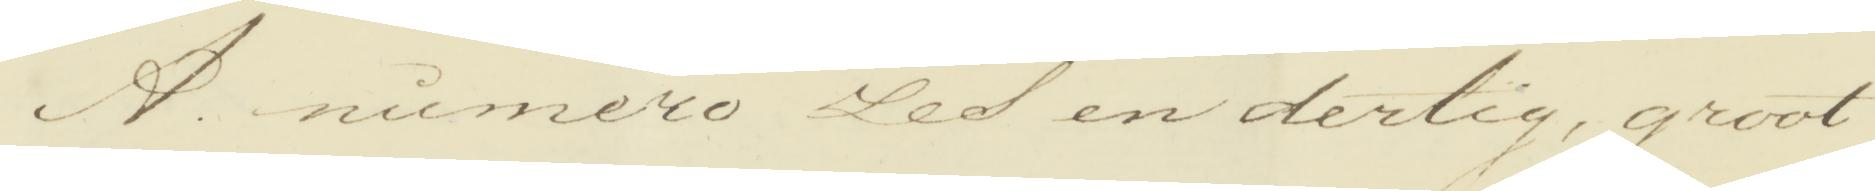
A. numero zes en dertig, groot
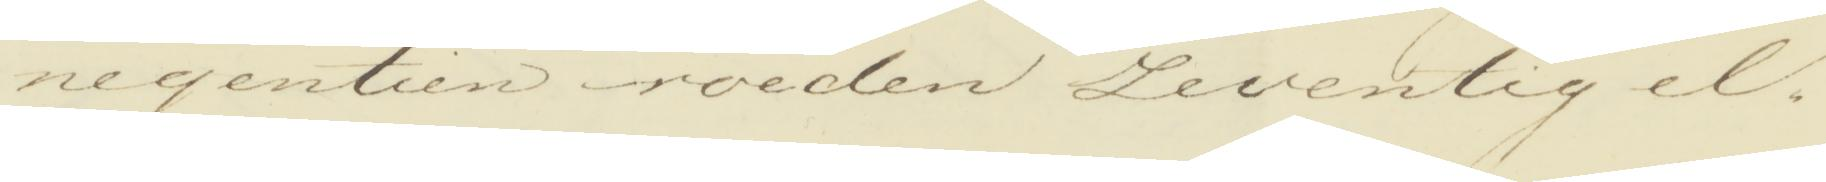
negentien roeden zeventig el„
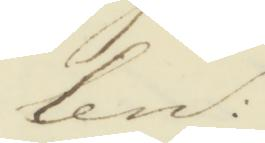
len:
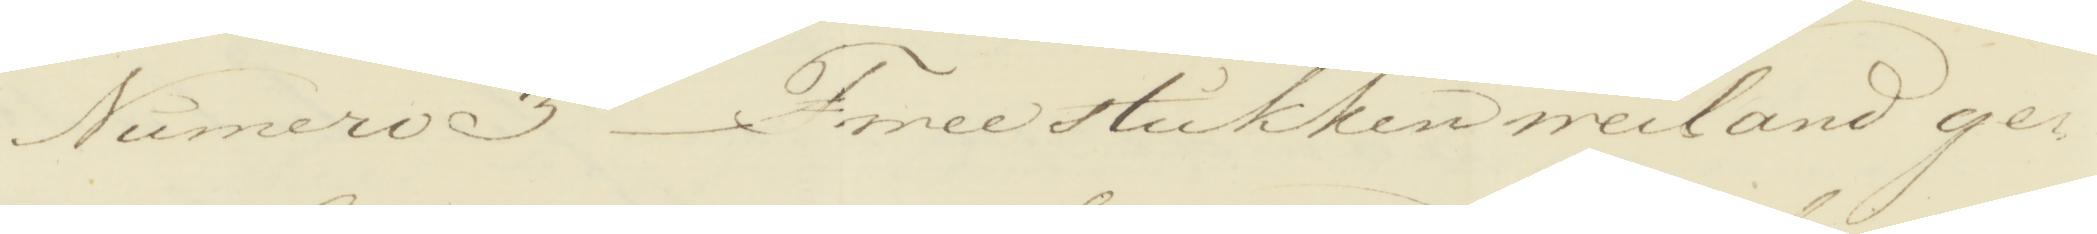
Numero 3 — Twee stukken weiland ge„
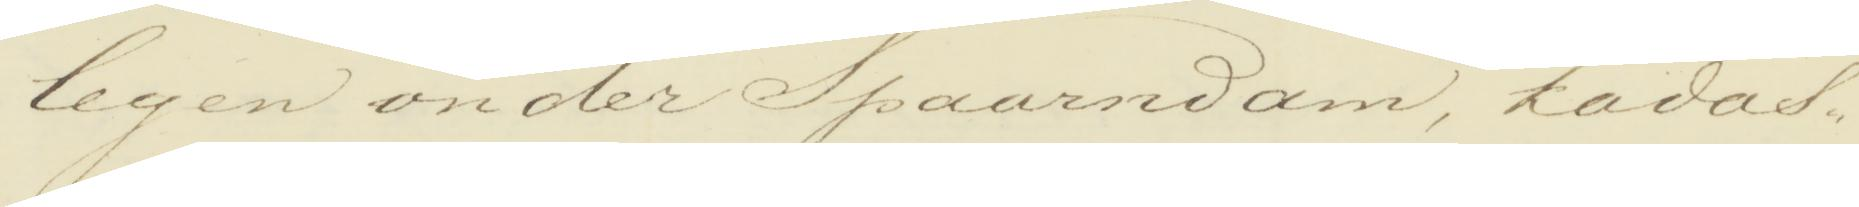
legen onder Spaarndam, kadas„
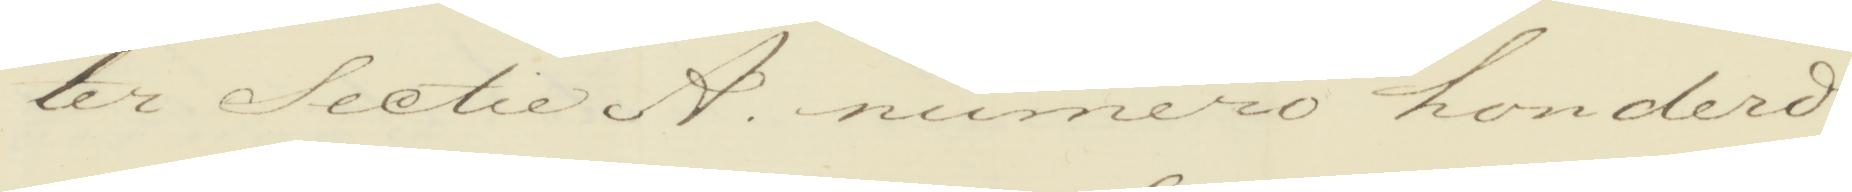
ter sectie A. numero honderd
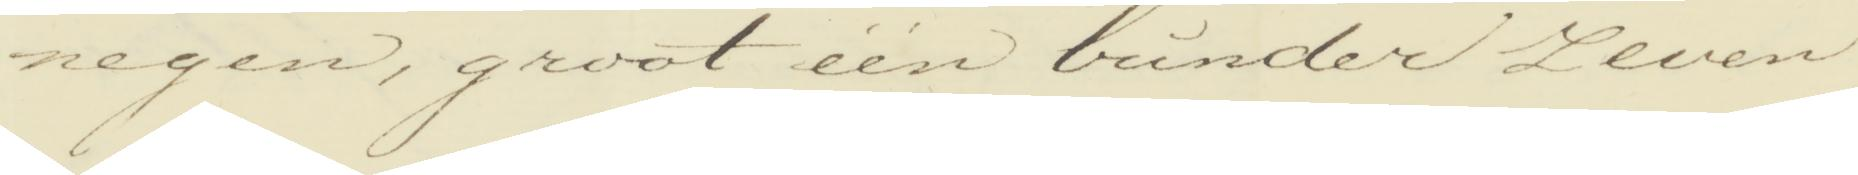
negen, groot één bunder zeven
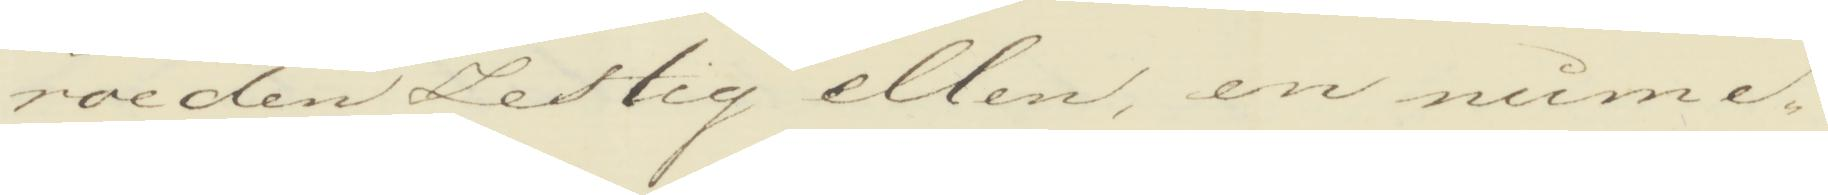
roeden zestig ellen, en nume„
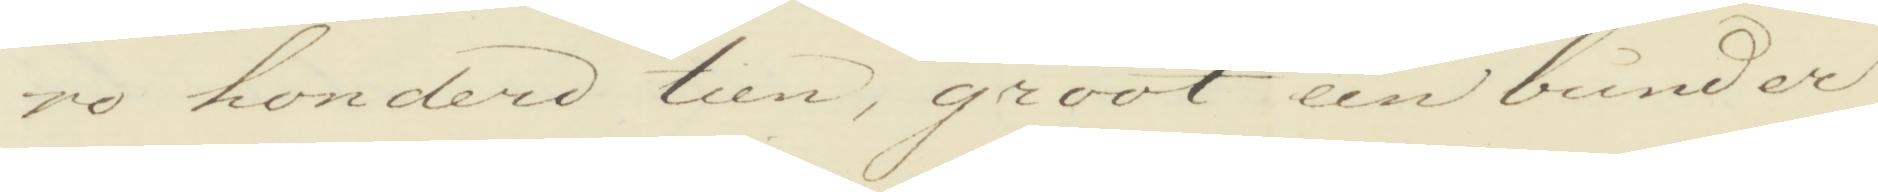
ro honderd tien, groot een bunder
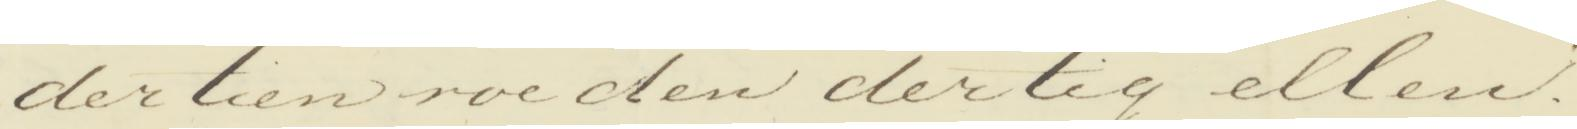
dertien roeden dertig ellen.
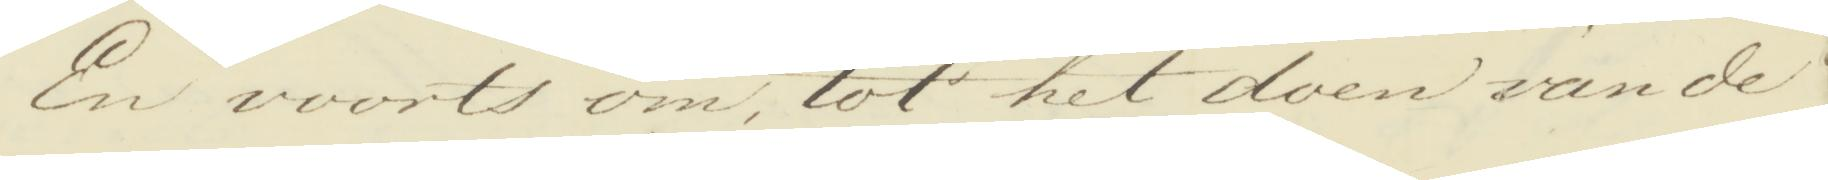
En voorts om, tot het doen van de
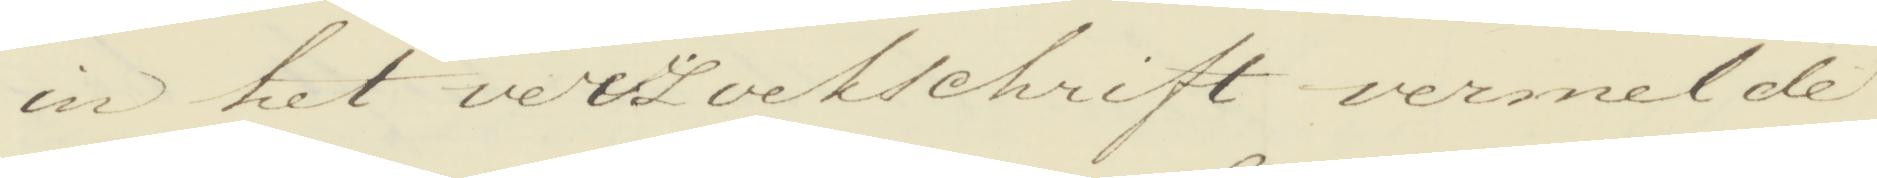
in het verzoekschrift vermelde
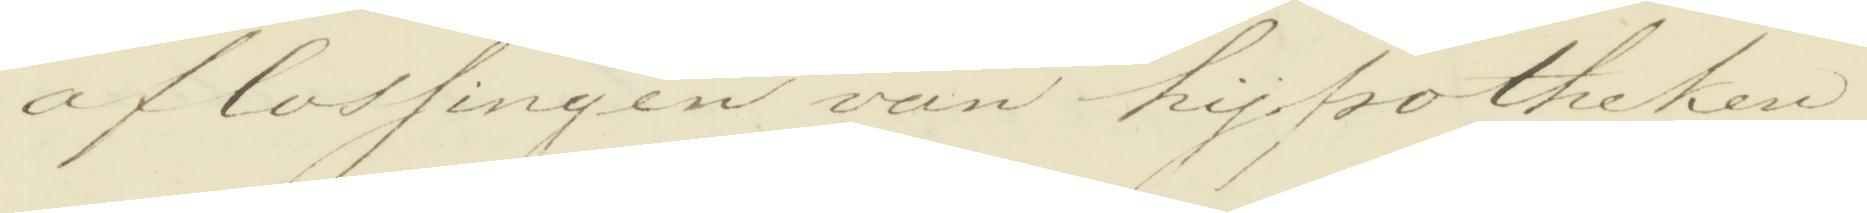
aflossingen van hijpotheken
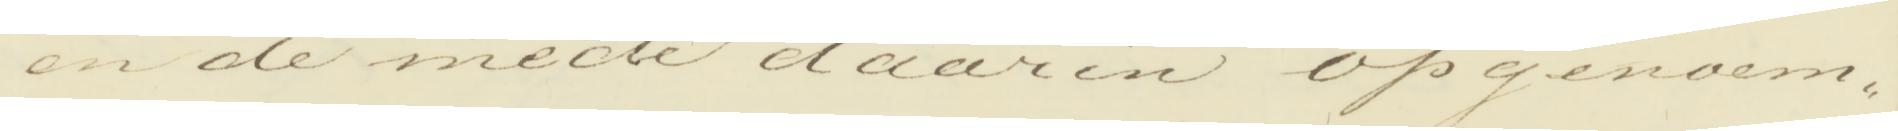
en de mede daarin opgenoem„
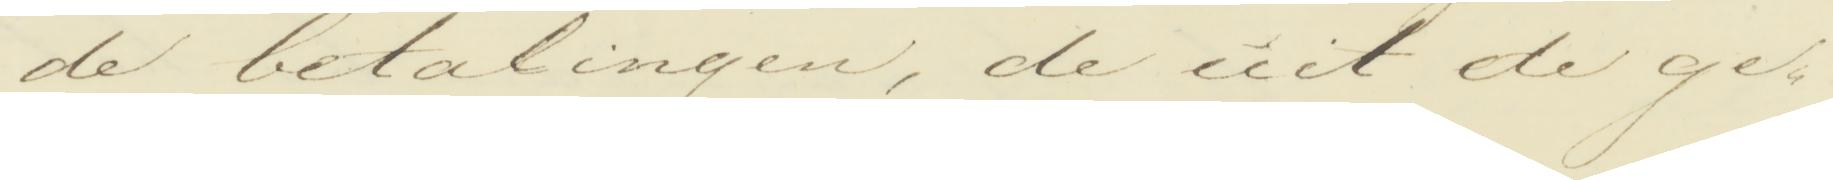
de betalingen, de uit de ge„
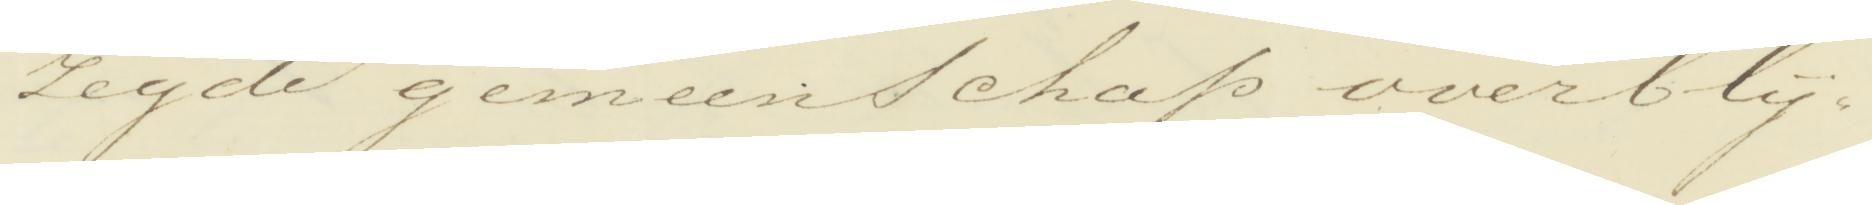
zegde gemeenschap overblij„
